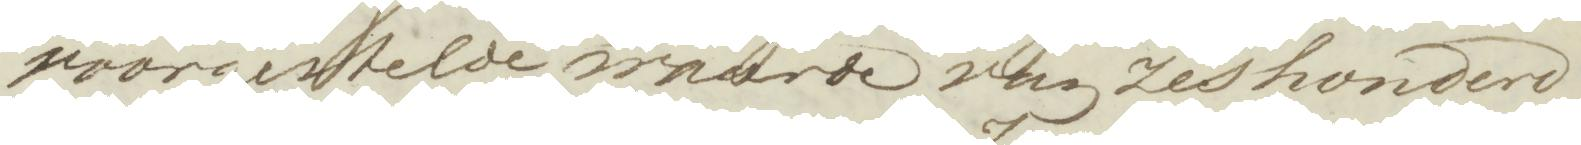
voorgestelde waarde van zes honderd
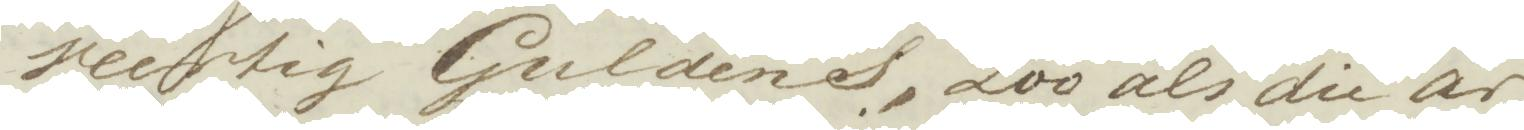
veertig Guldens, zoo als die ar
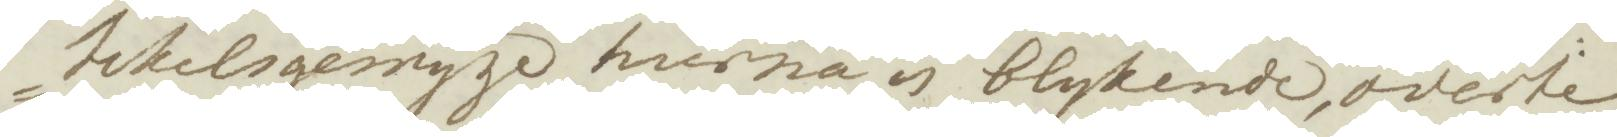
„tikelsgewyze hierna is blykende, overte
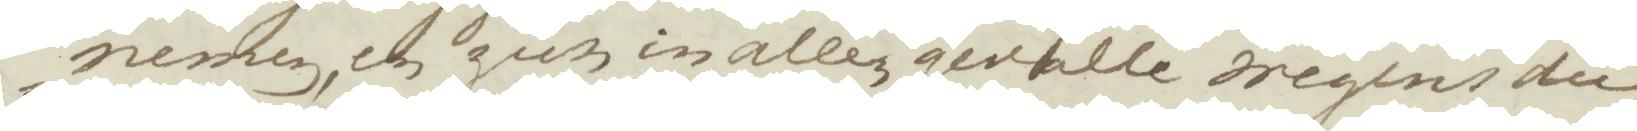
„nemen, en zien in allen gevalle wegens die
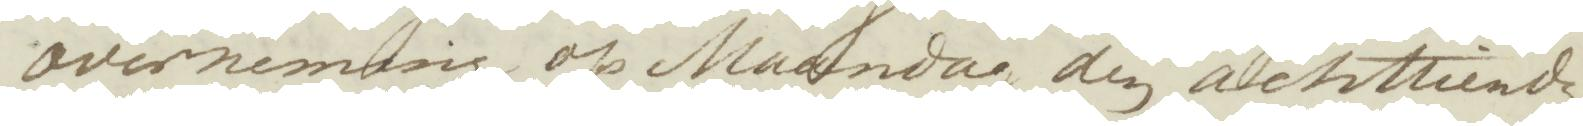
overneming op Maandag den achttienden
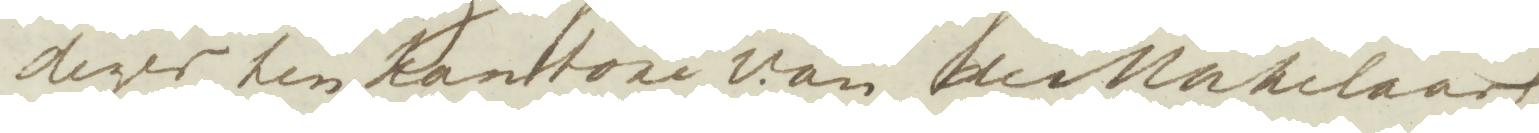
dezer ten kantore van de Makelaars
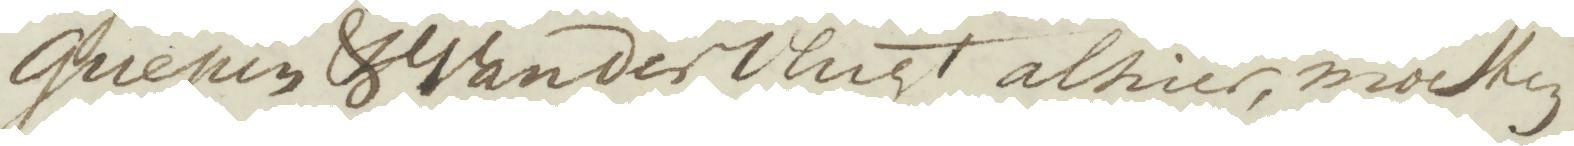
Guepin & Vander Vlugt alhier, moeten
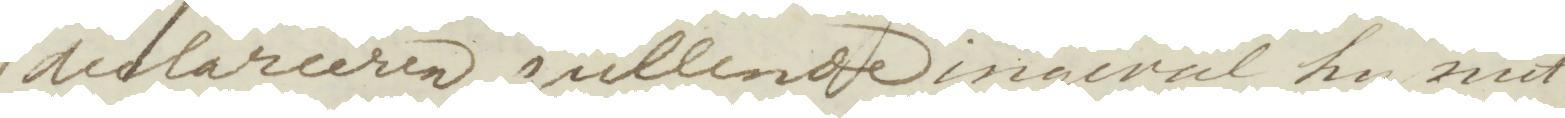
declareeren, zullende ingeval hy niet
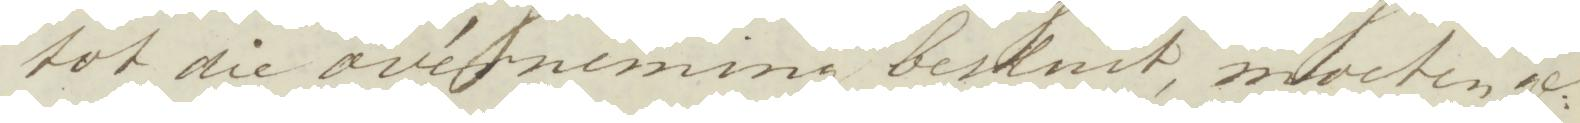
tot die overneming besluit, moeten ge„
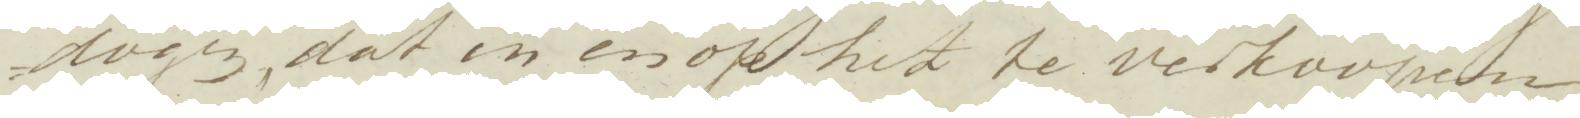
„dogen, dat in en op het te verkoopen
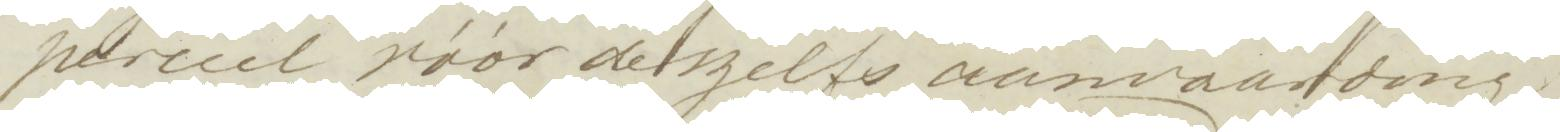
perceel vóór deszelfs aanvaarding
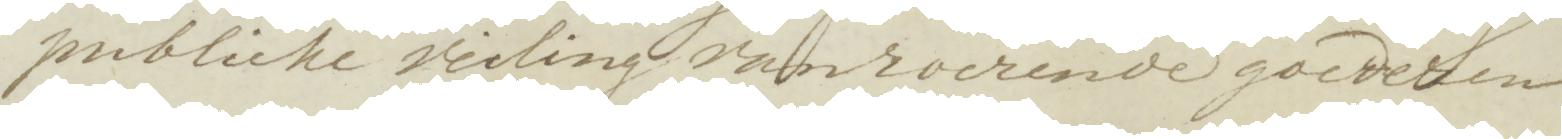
publieke veiling van roerende goederen
